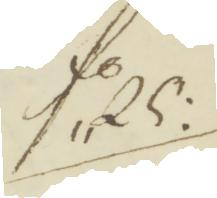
f„o 25:
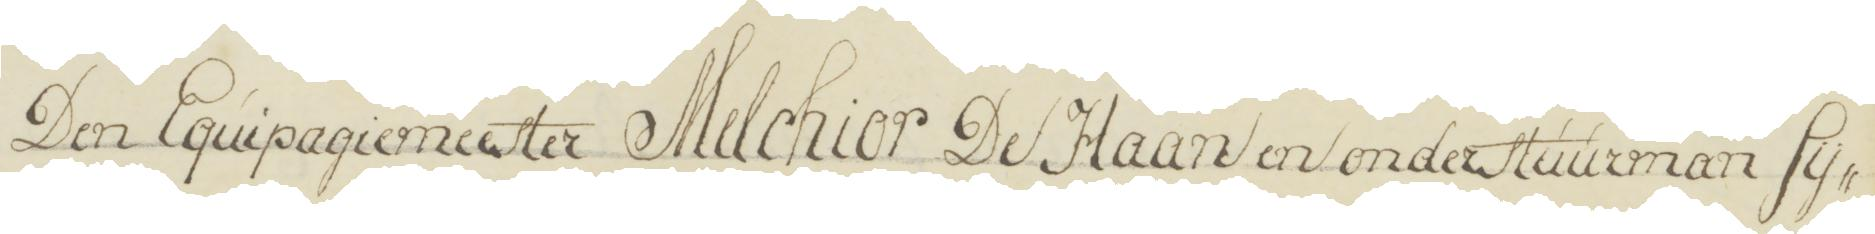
Den Equipagiemeester Melchior De Haan en onder stuurman Sij„
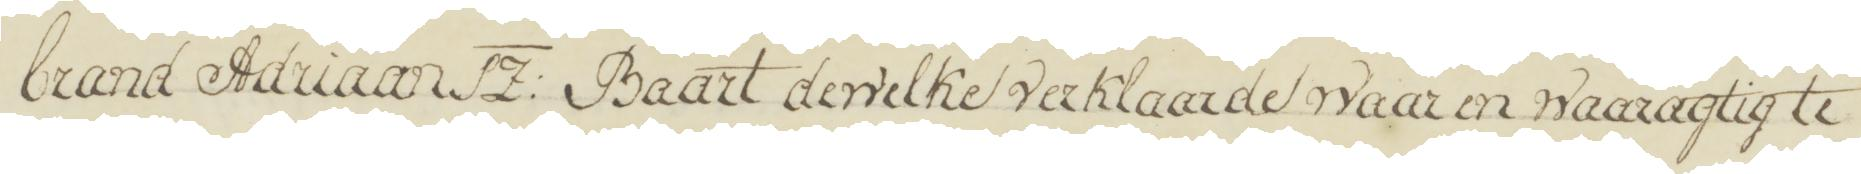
brand Adriaansz: Baart dewelke verklaarde waar en waaragtig te
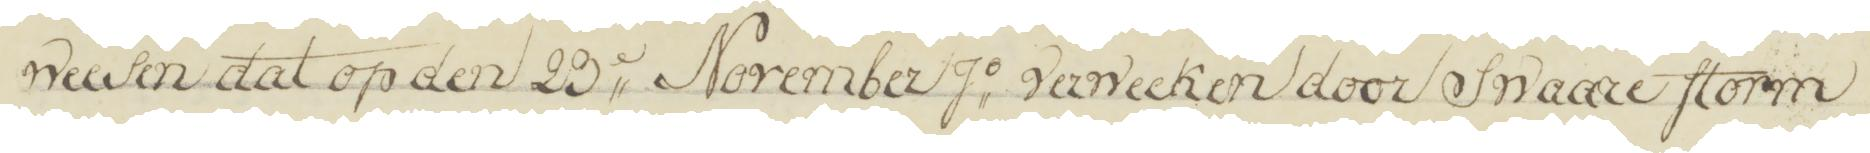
weesen dat op den 23„e November j„o verweeken door swaare storm
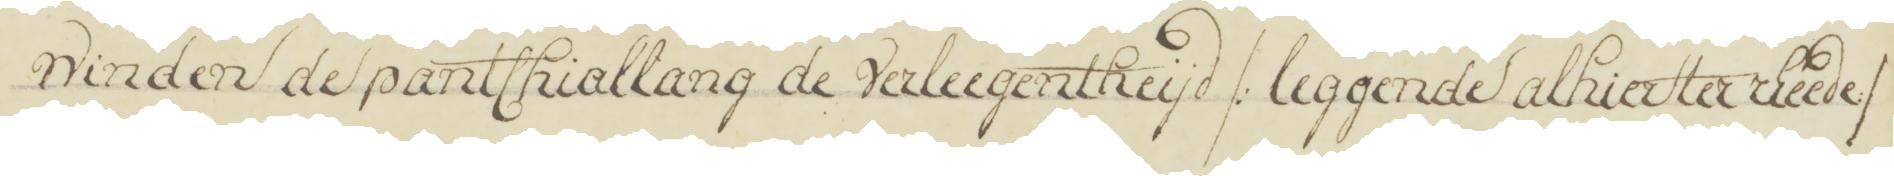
winden de pantchiallang de verleegentheijd /: leggende alhier ter rheede:/
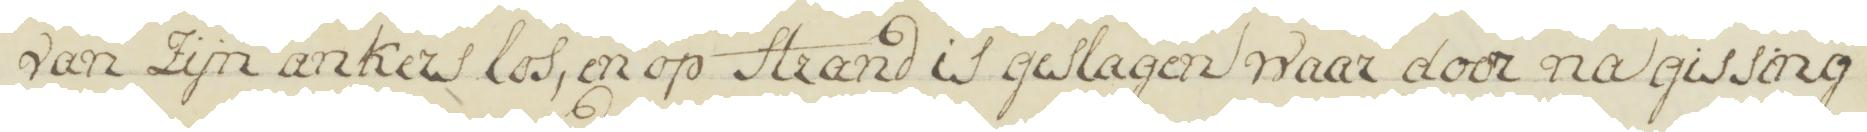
van zijn ankers los, en op strand is geslagen waar door na gissing
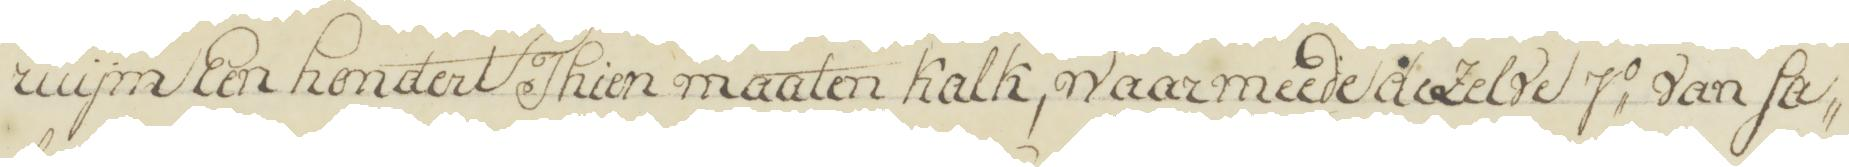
ruijm Een hondert Thien maaten kalk, waarmeede dezelve j„o van sa„
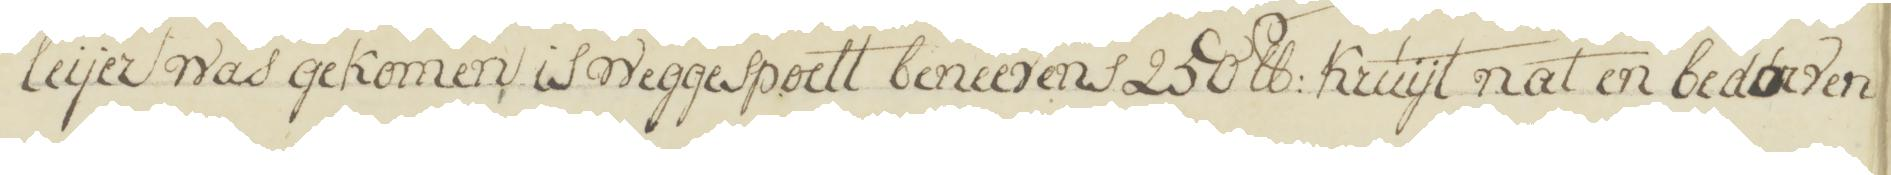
leijer was gekomen is weggespoelt beneevens 250 lb: kruijt nat en bedorven
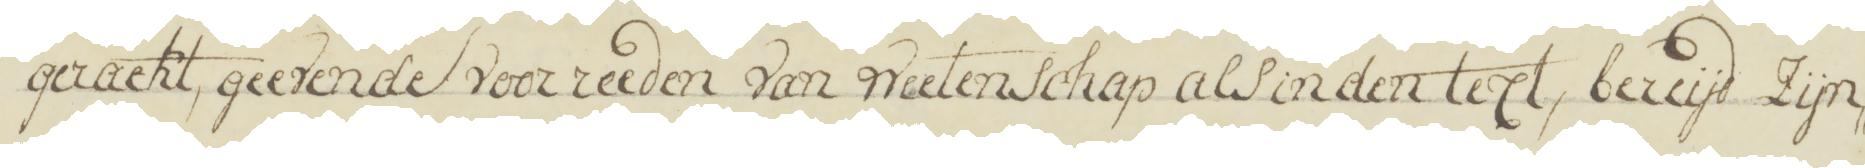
geraekt, geevende voor reeden van weetenschap als in den text, bereijd zijn„
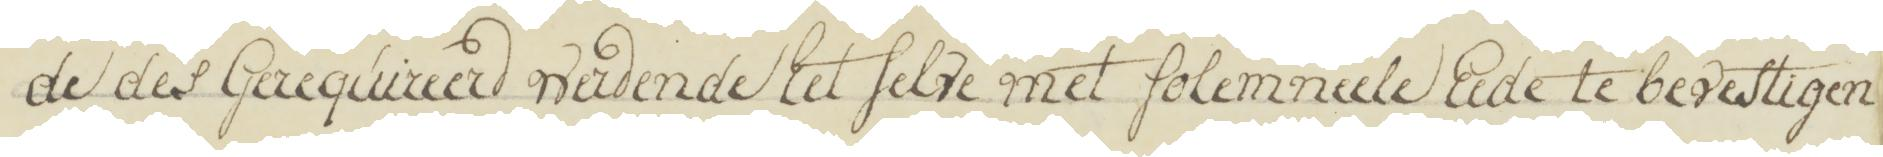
de des Gerequireerd werdende het selve met solemneele Eede te bevestigen
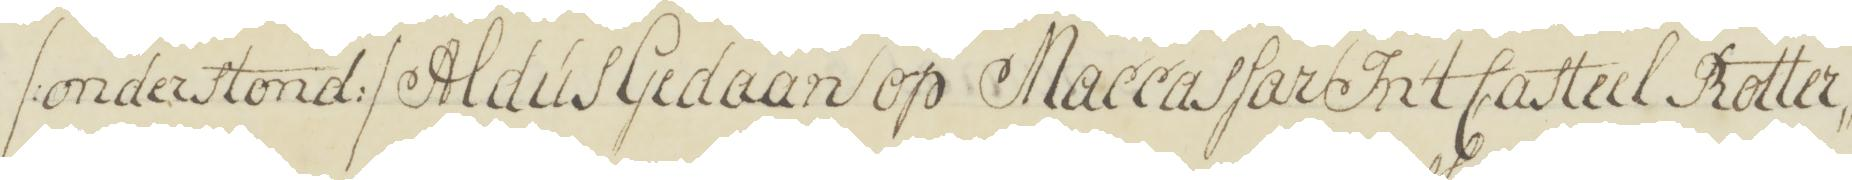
/:onderstond:/ Aldus Gedaan op Maccassar In’t Casteel Rotter„
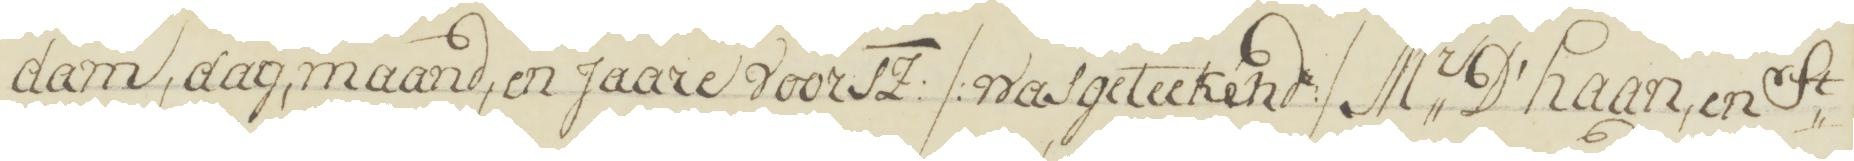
dam, dag, maand, en jaare voorsz: /:was geteekend:/ M„r D'haan, en S„t
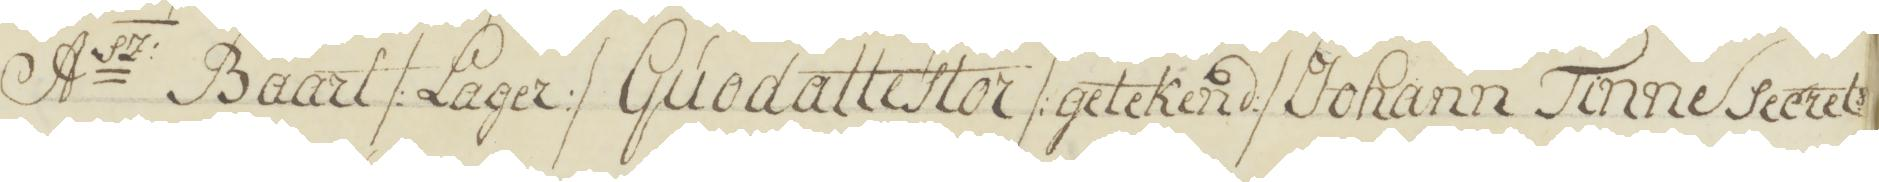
A=sz: Baart /:Lager:/ Quod attestor /:getekend:/ Iohann Tinne secrets
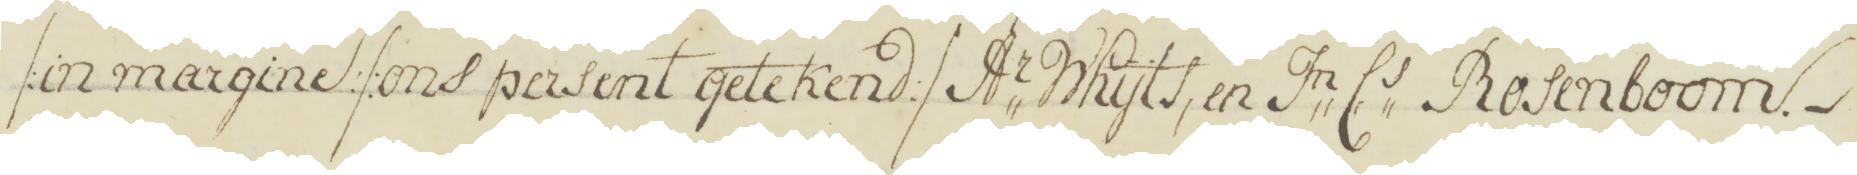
/:in margine :/: ons persent getekend:/ A„r Whijts, en I„n C„s Rosenboom. —
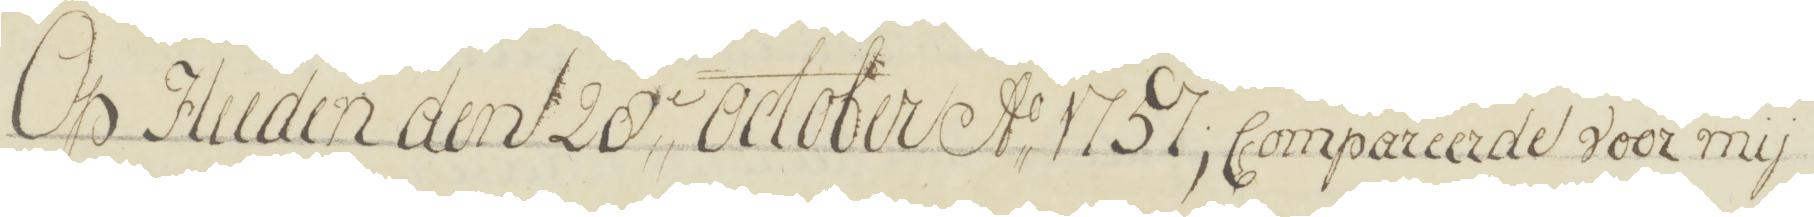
Op Heeden den 28„e october A„o 1757; Compareerde voor mij
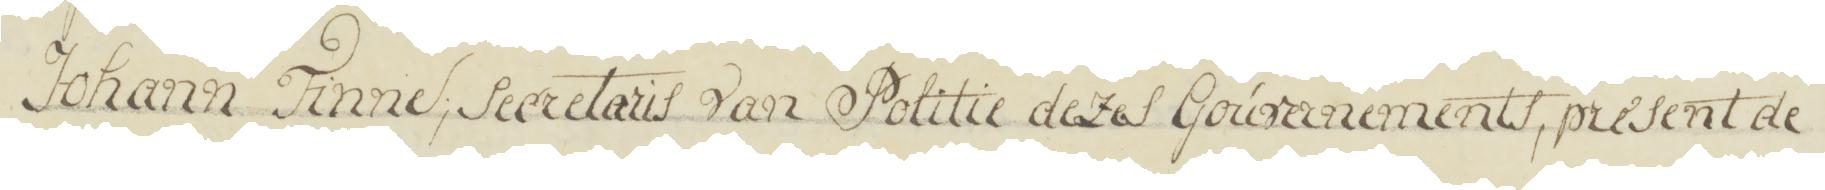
Iohann Tinne, secretaris van Politie dezes Gouvernements, present de
